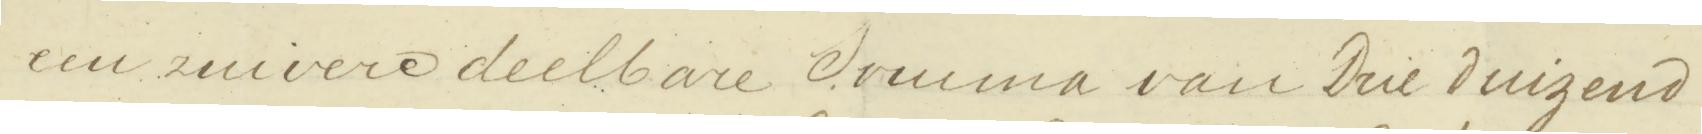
een zuivere deelbare Somma van Drie duizend
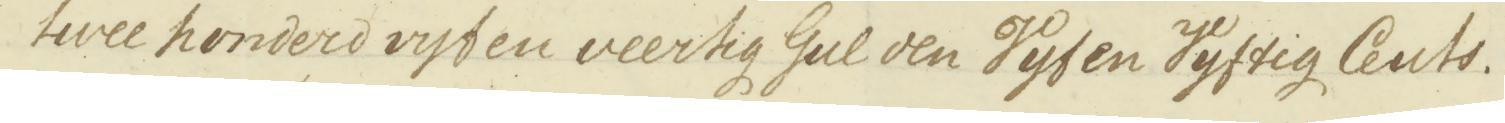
twee honderd vyf en veertig Gulden Vyf en Vyftig Cents.
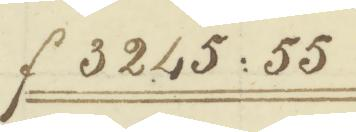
ƒ 3245: 55
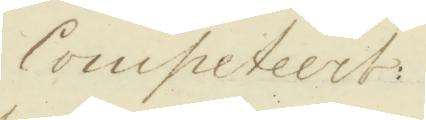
Competeert:
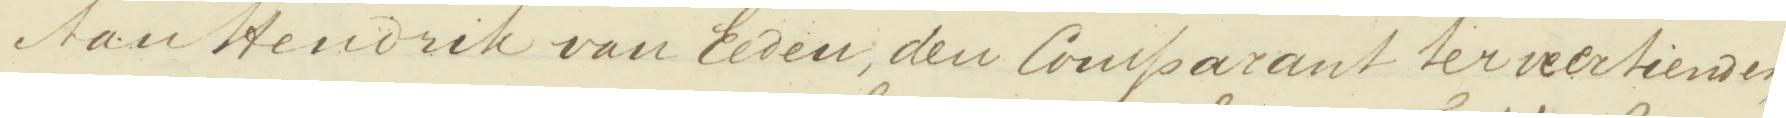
Aan Hendrik van Eeden, den Comparant ter veertiender,
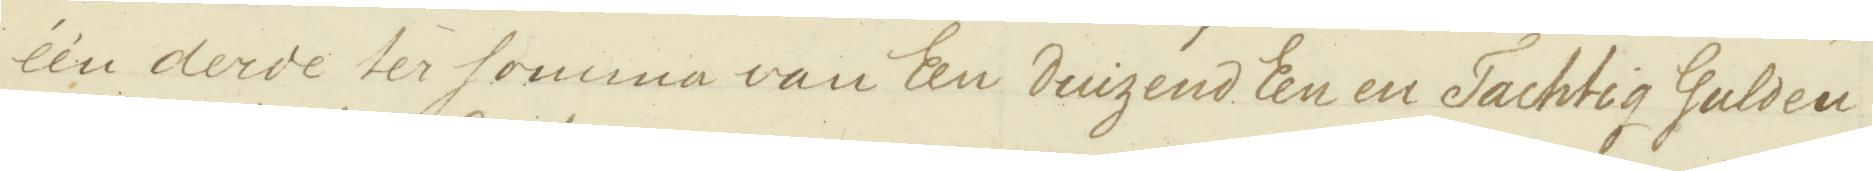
één derde ter somma van Een duizend. Een en Tachtig Gulden
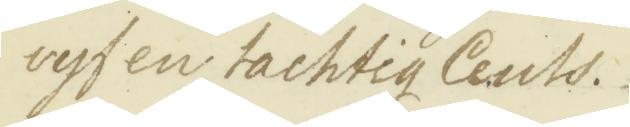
vyf en tachtig Cents.
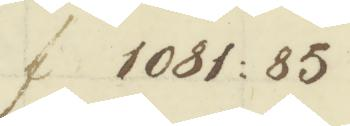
ƒ 1081:85
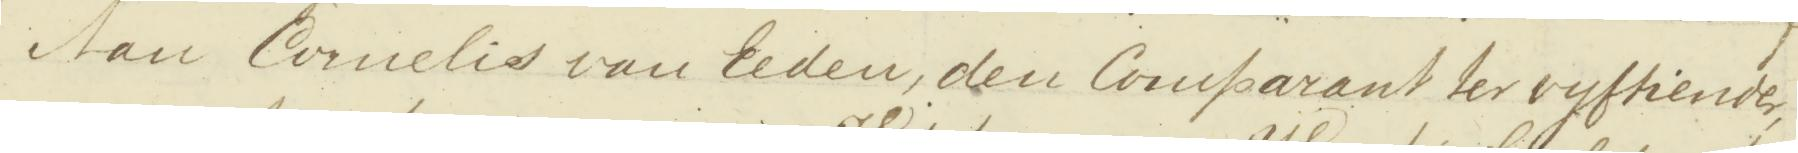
Aan Cornelis van Eeden, den Comparant ter vijftiende,
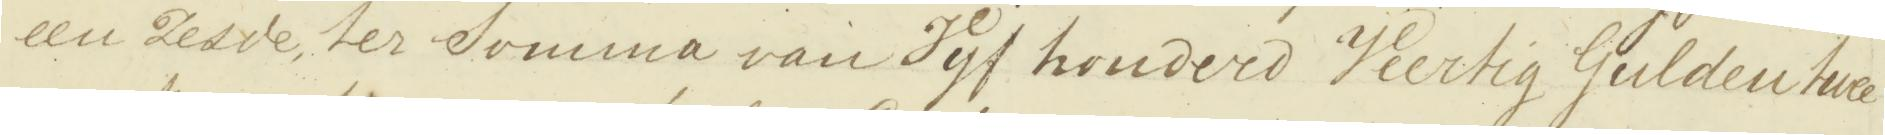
een zesde, ter Somma van Vyf honderd Veertig Gulden twee
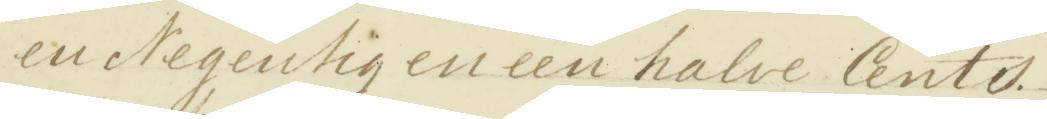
en Negentig en een halve Cents.
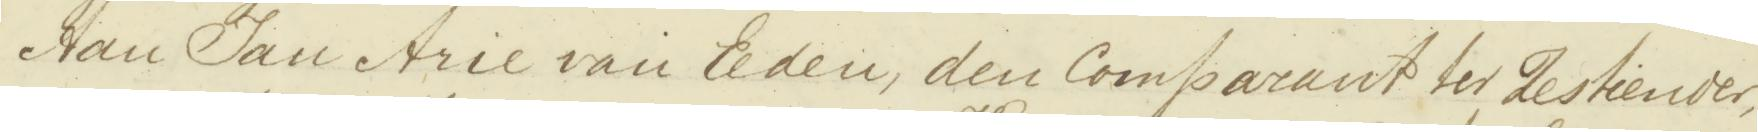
Aan Ian Arie van Eeden, den Comparant der zestiender,
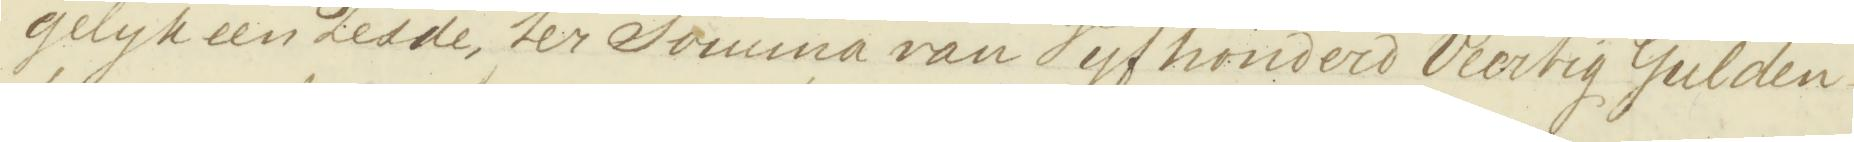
gelyk een zesde, ter Somma van Vyf honderd Veertig Gulden
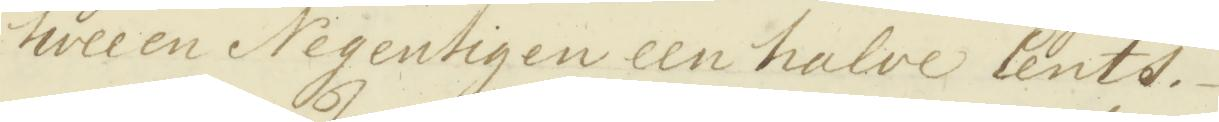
twee en Negentig en een halve Cents.
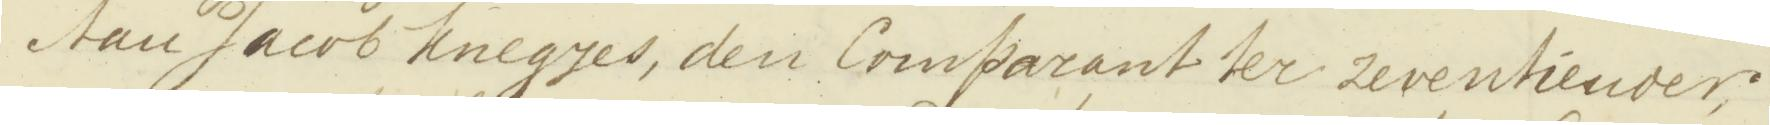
Aan Jacob Knegjes, den Comparant ter zeventiender,
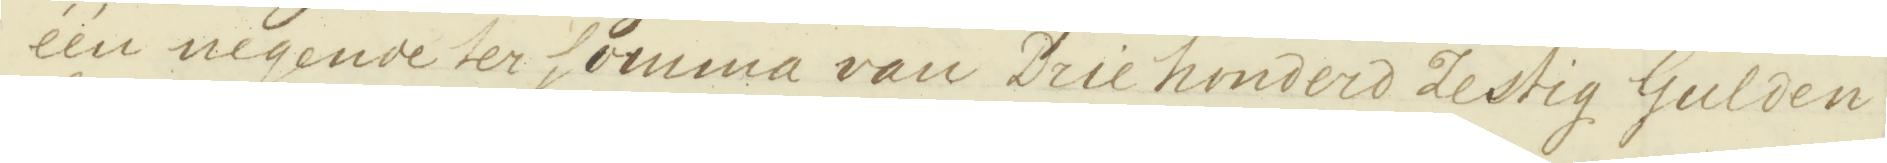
één negende ter somma van Drie honderd Zestig Gulden
